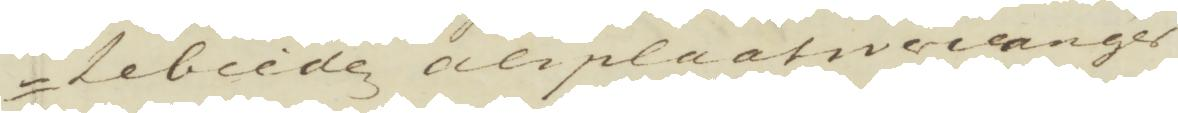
=tebieden als plaatsvervanger
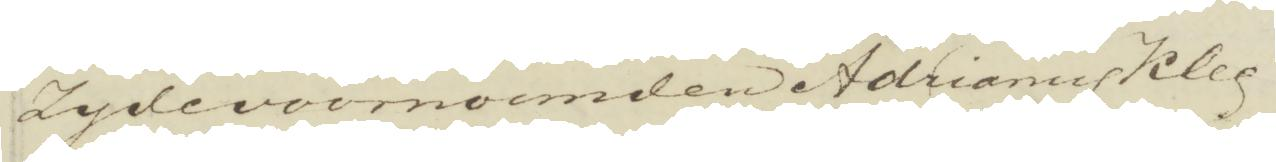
zyde voornoemden Adrianus Klee
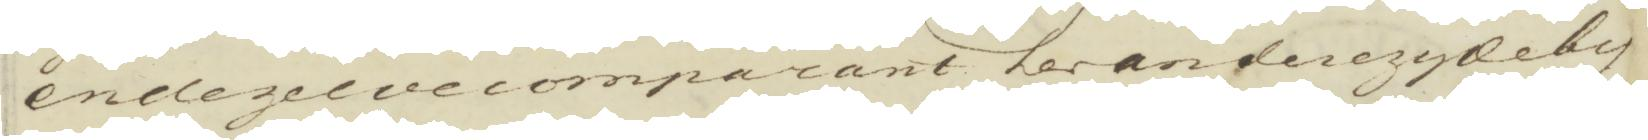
en dezelve comparant ter andere zyde by
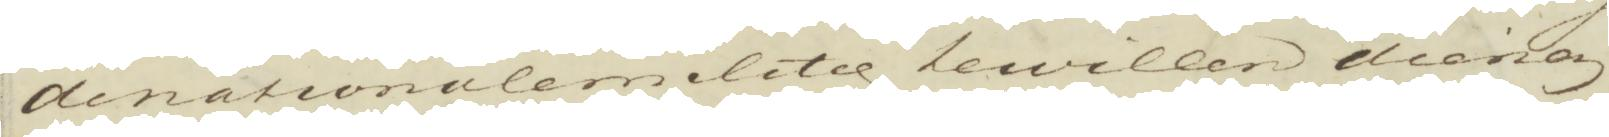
de nationale militie tewillen dienen
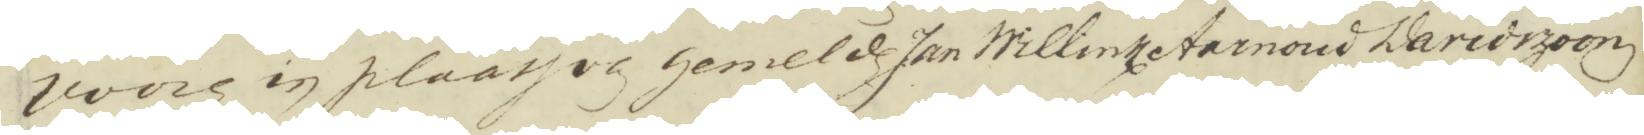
vooren in plaats van gemelde Jan Willink Aarnoud Davidszoon
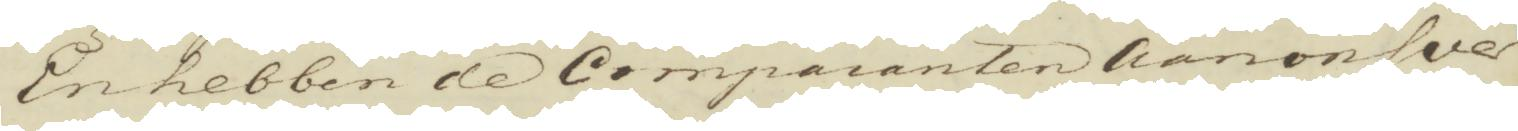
En hebben de Comparanten aan onsver
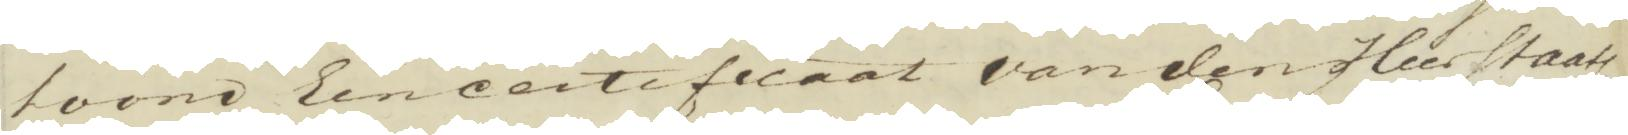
toond Een certifcaat van den Heer staats
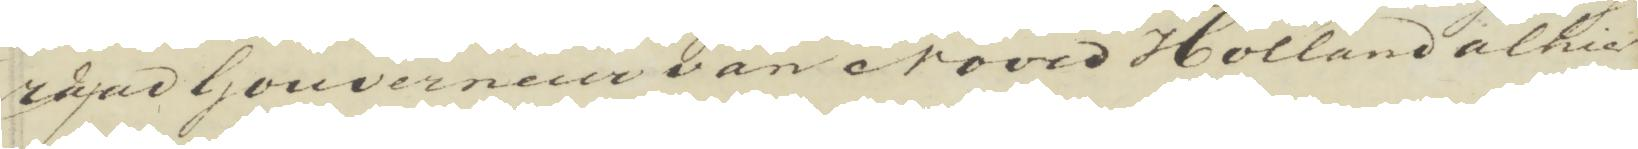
raad Gouverneur van Noord Holland alhier
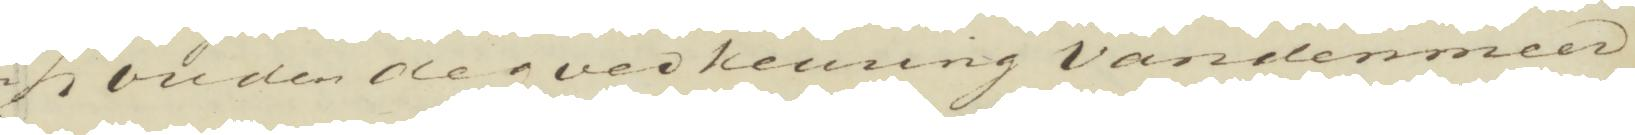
houden de goedkeuring van den meer
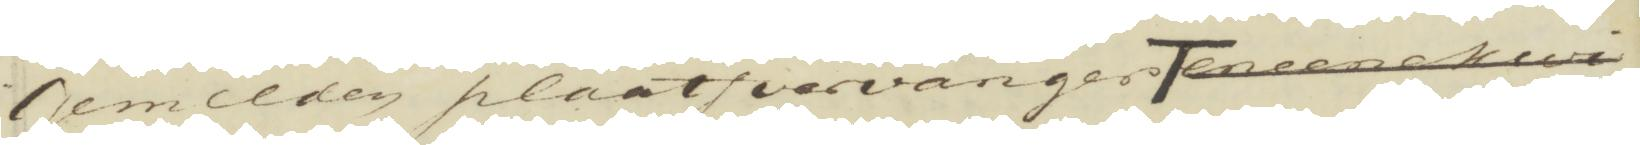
gemelden plaatsvervanger ¶ en een kwi
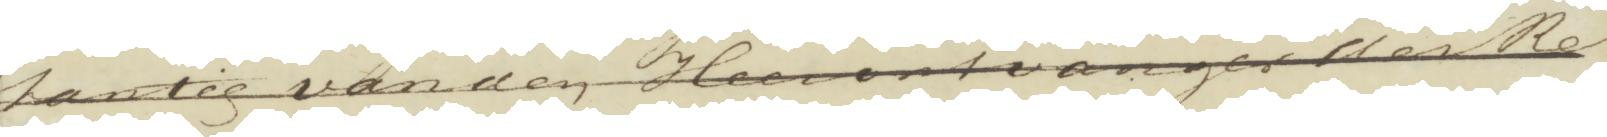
tantie van den Heer ontvanger der Re
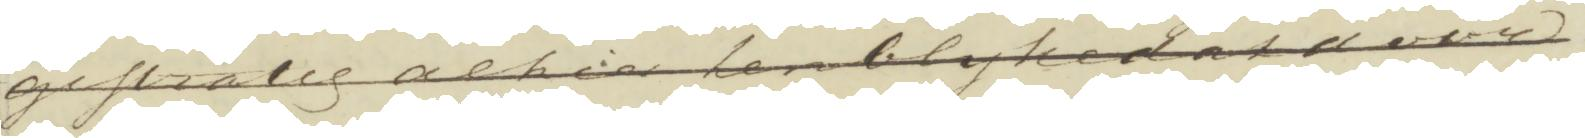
gistratie alhier ten blyke dat door
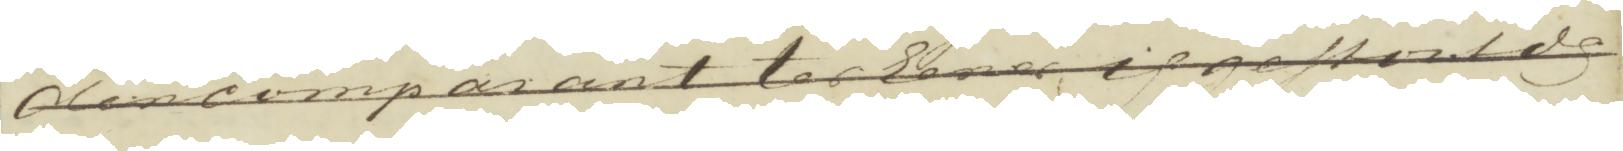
den comparant ter Eener is gestort de
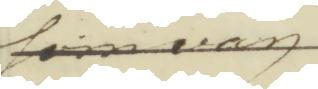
som van
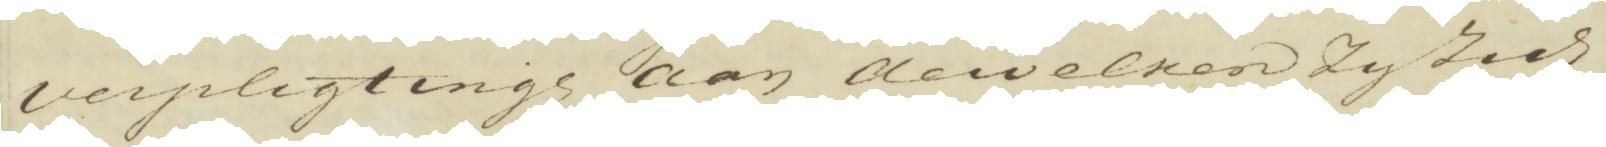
verpligtinge aan dewelken zy zich
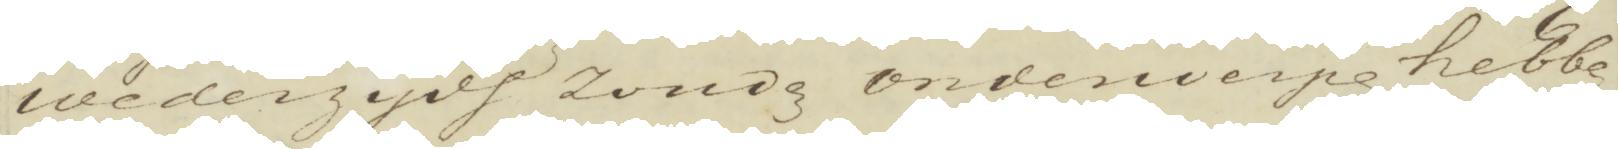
wederzyds zouden onderwerpen hebben
